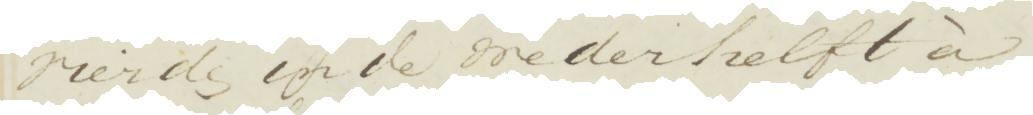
vierde in de wederhelft à
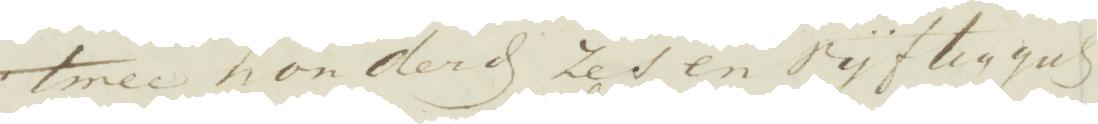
twee honderd zes en vijftig gul
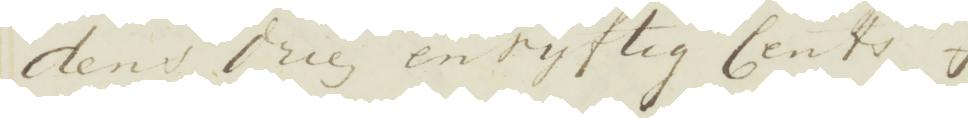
dens drie en vijftig Cents
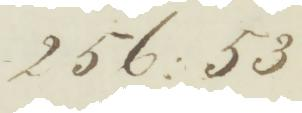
256: 53
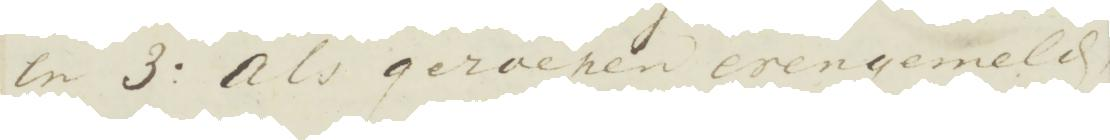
en 3: als geroepen evengemeld
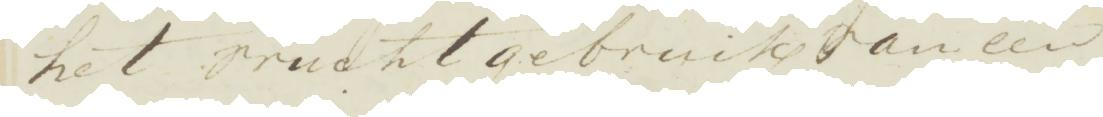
het vruchtgebruik van een
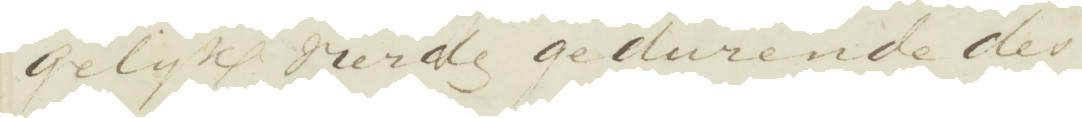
gelijk vierde gedurende des
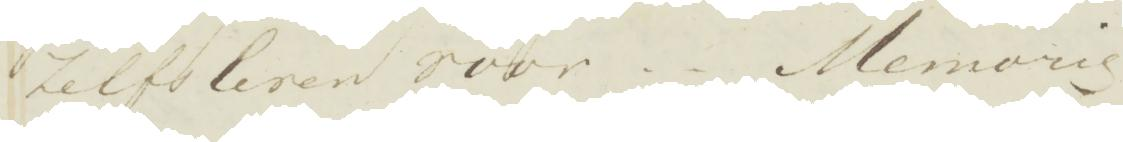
=zelfs leven voor . . Memorie
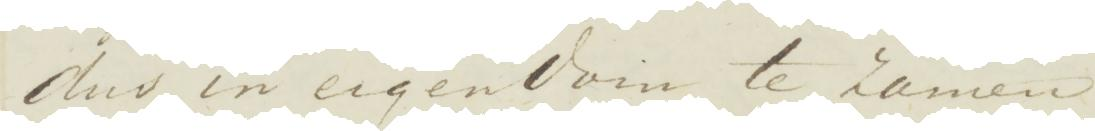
dus in eigendom te zamen
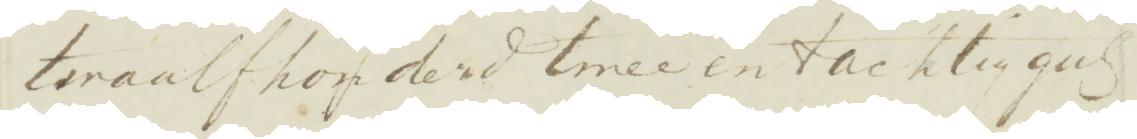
twaalf honderd twee en tachtig gul
